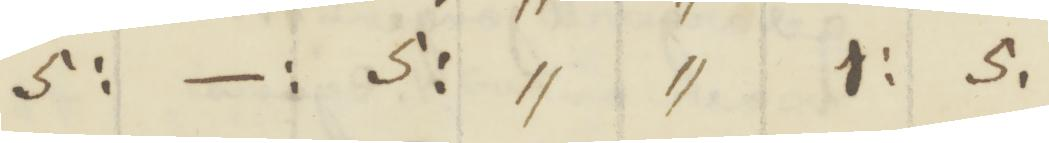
5: — : 5: „ „ 1: 5.
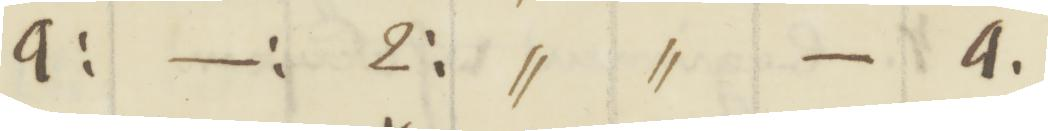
4: —: 2: „ „ 4.
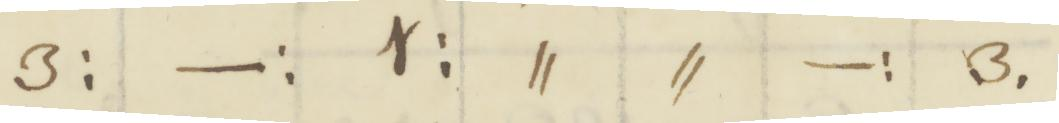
3: — : 1: „ „ —: 3.
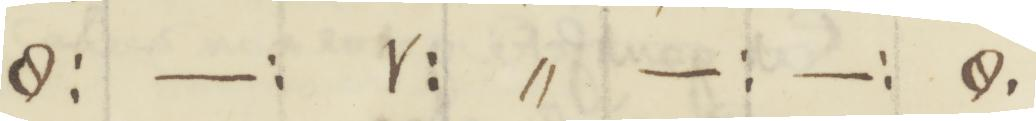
8: —: 1: „ — : —: 8.
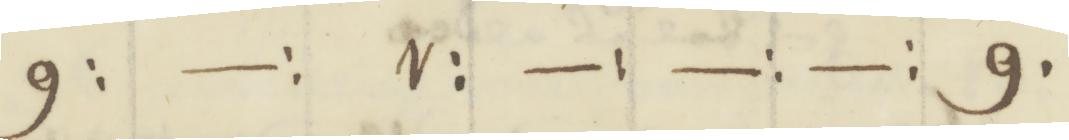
9: —: 1: —: —: —: 9.
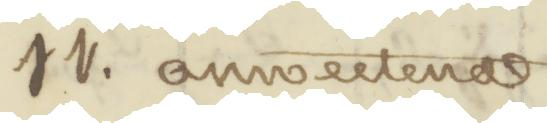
11. onweetende
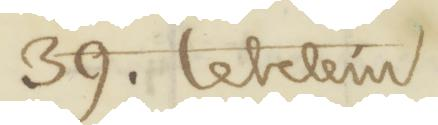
39. teklein
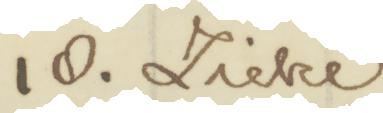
18. zieke
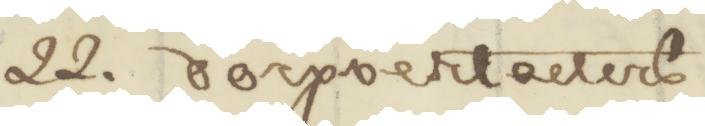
22. dorpverlaeters
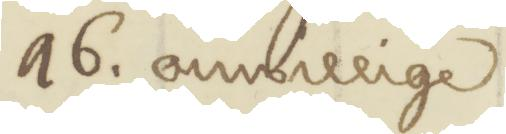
46. onwillige
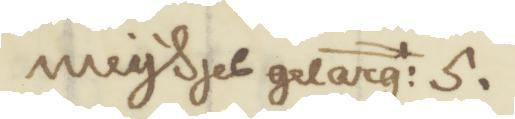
meijsjes gelarg:t 5.
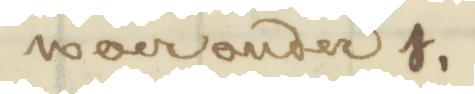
waer onder 1.
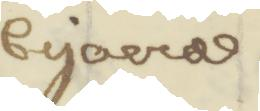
bejaerde
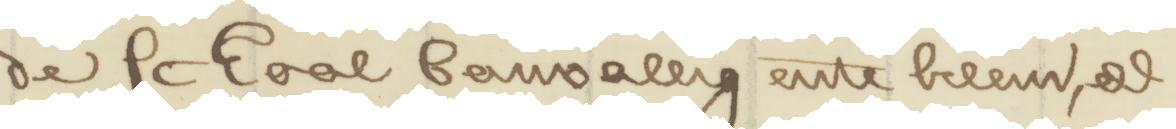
de school bouvallig ente klein, de
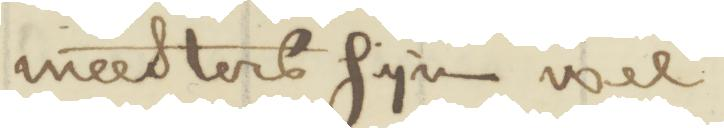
meesters sijn wel
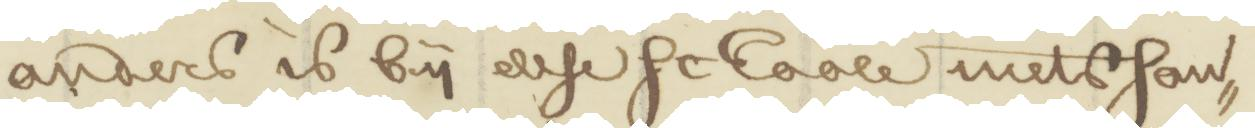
anders is bij dese schoole niets son„
